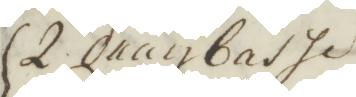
2 draijbasse
